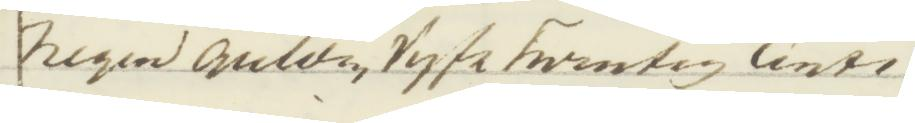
Negen gulden Vyf & Twintig Cents
